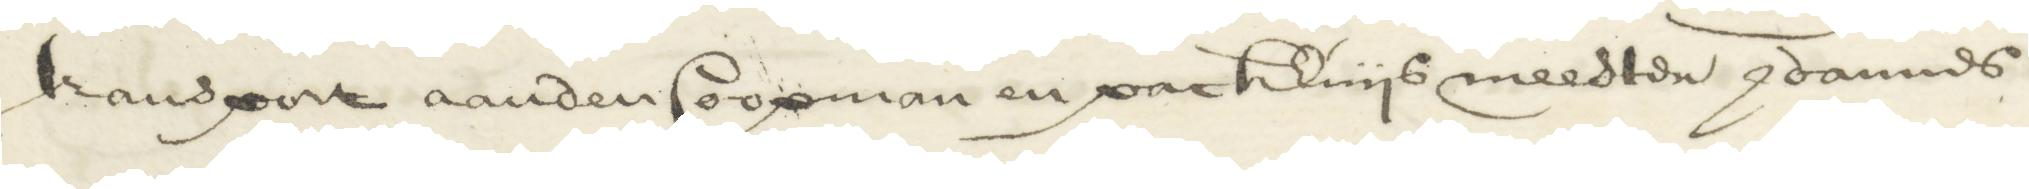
transport aan den Coopman en packhuijs meester joannes
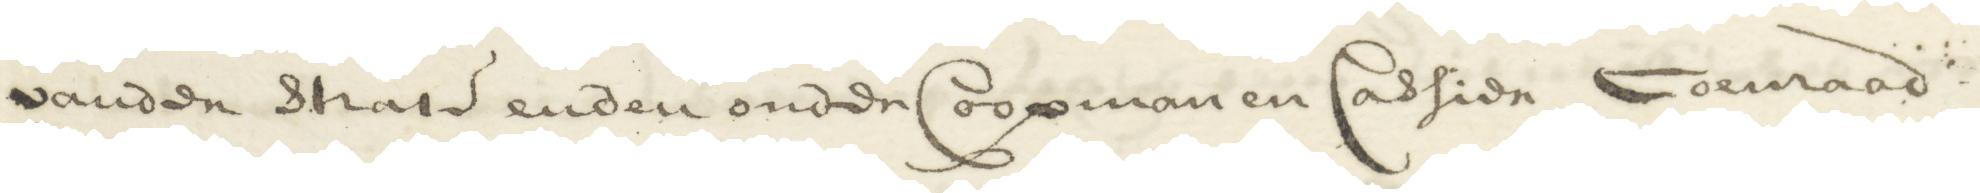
van den strate en den onder Coopman en Cassier Coenraad
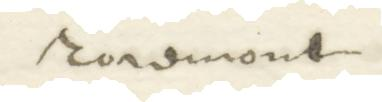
rosemont
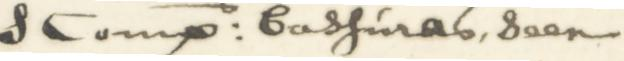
s Comp:s bassuras, seer
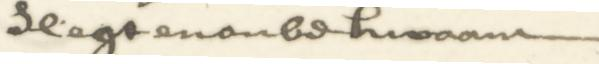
slegt en onbekwaam
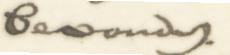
bevonden.
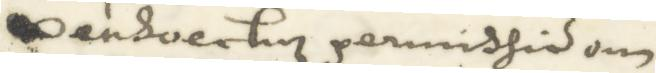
versoecken permissie om
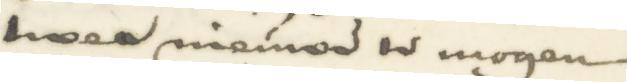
twee nieuwe te mogen
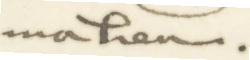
maken.
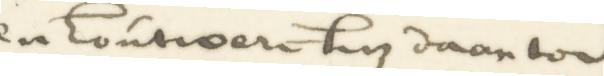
en houtwercken daar toe
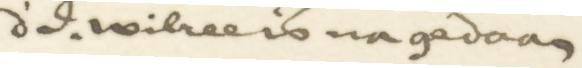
d’E. wilree is na gedaan
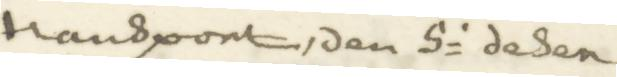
transport, den 5=' desen
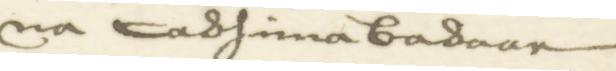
na cassima basaar
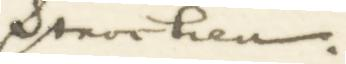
vertrocken.
